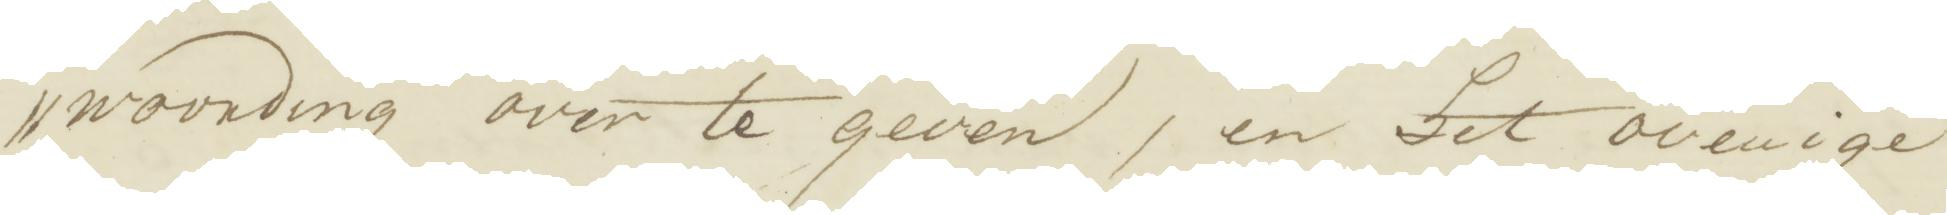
„woording over te geven, en het overige
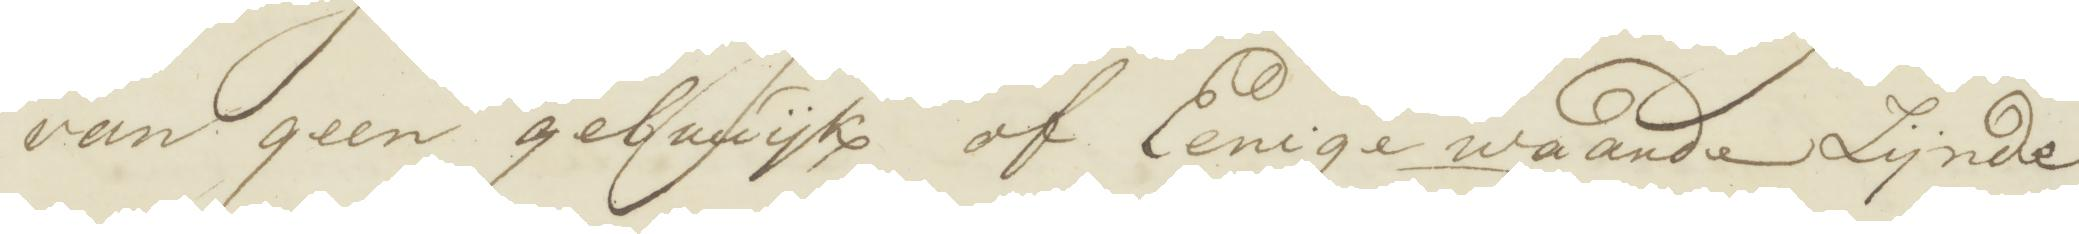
van geen gebruijk of Eenige waarde Zijnde
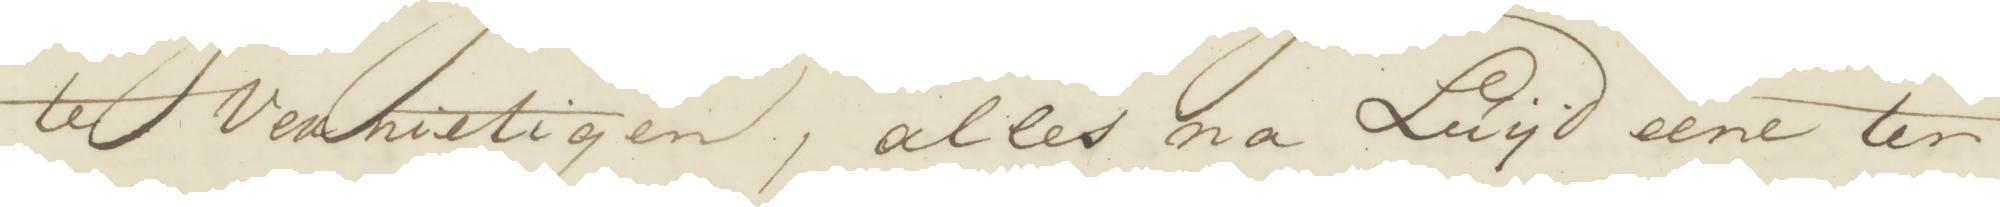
te vernietigen, alles na Luijd eene ter
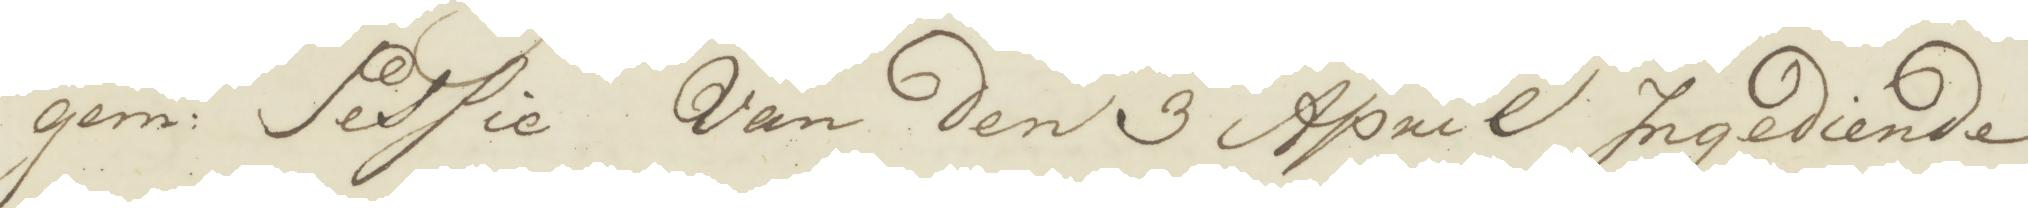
gem: Sessie van den 3 April Jngediende
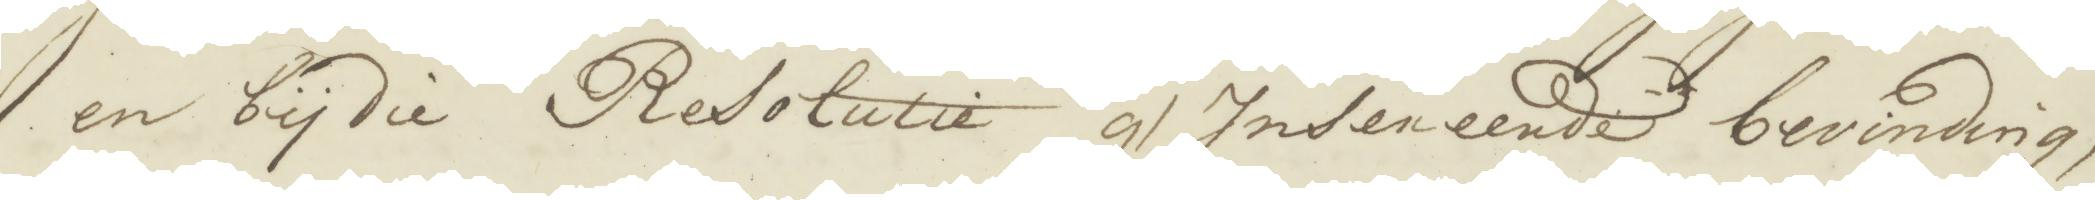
en bij die Resolutie g'Jnsereende bevinding,
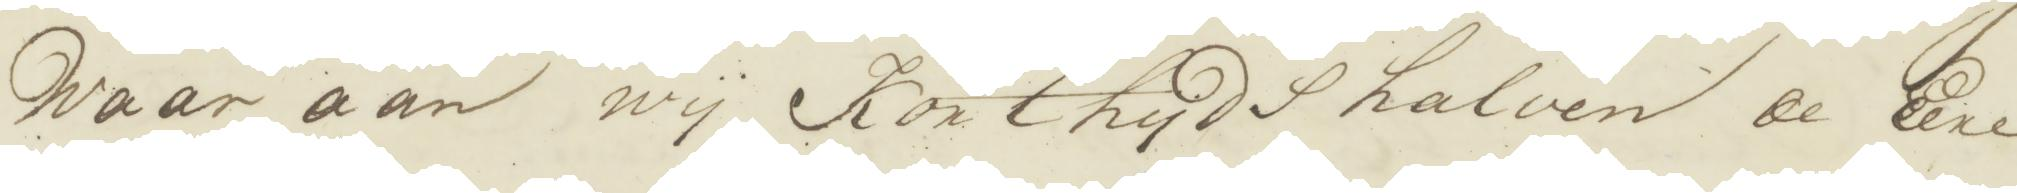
waar aan wij Korthijds halven de Eere
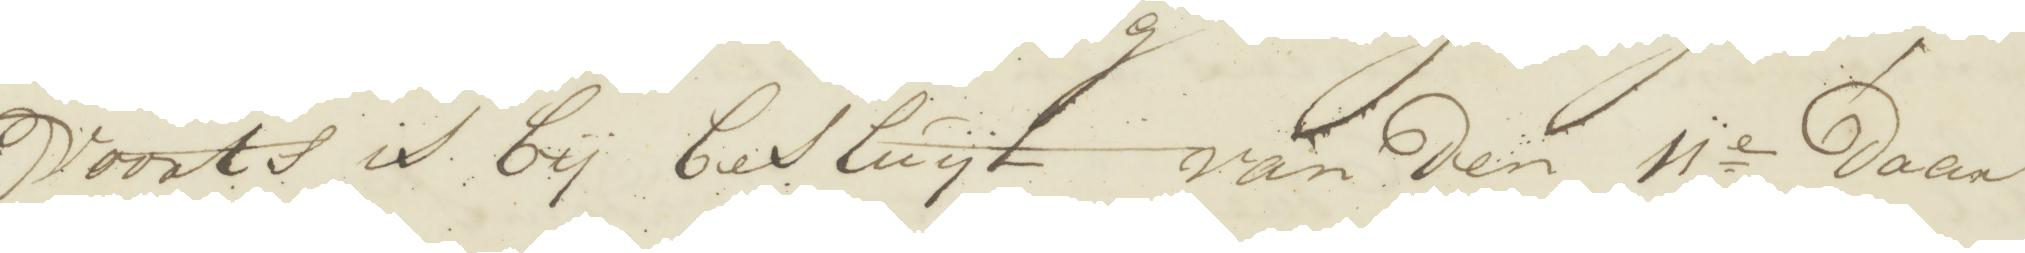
Voorts is bij besluijt van den 11=e daar
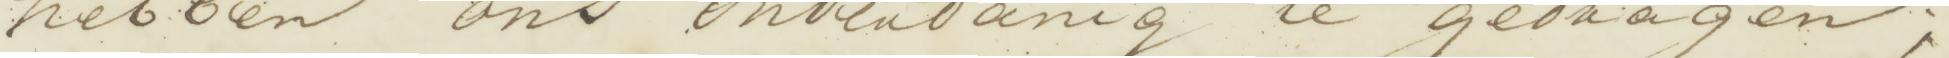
hebben ons onderdanig te gedragen;
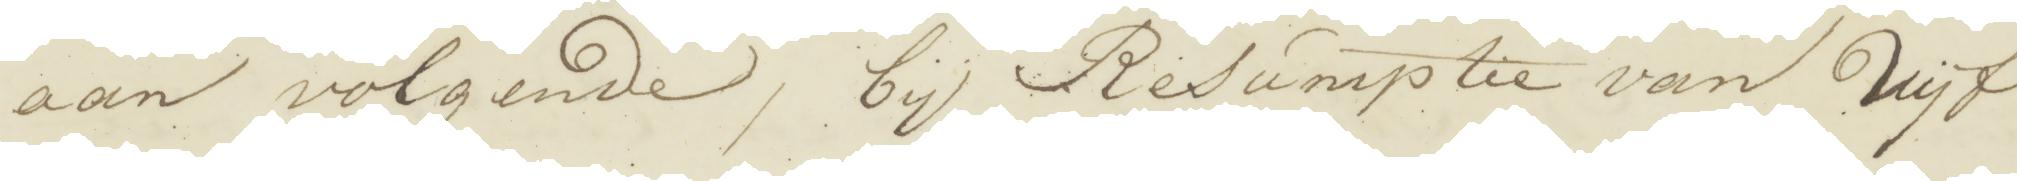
aan volgende, bij Resumptie van Vijf
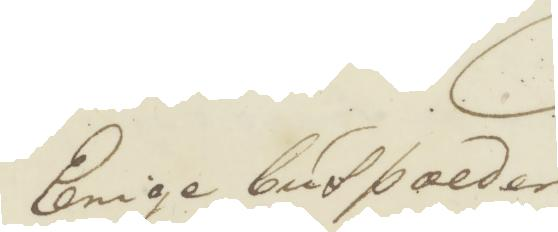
Eenige buspoeder
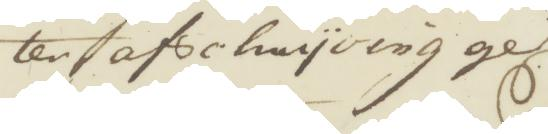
ter afschrijving ge-
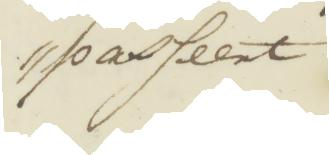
„passeert
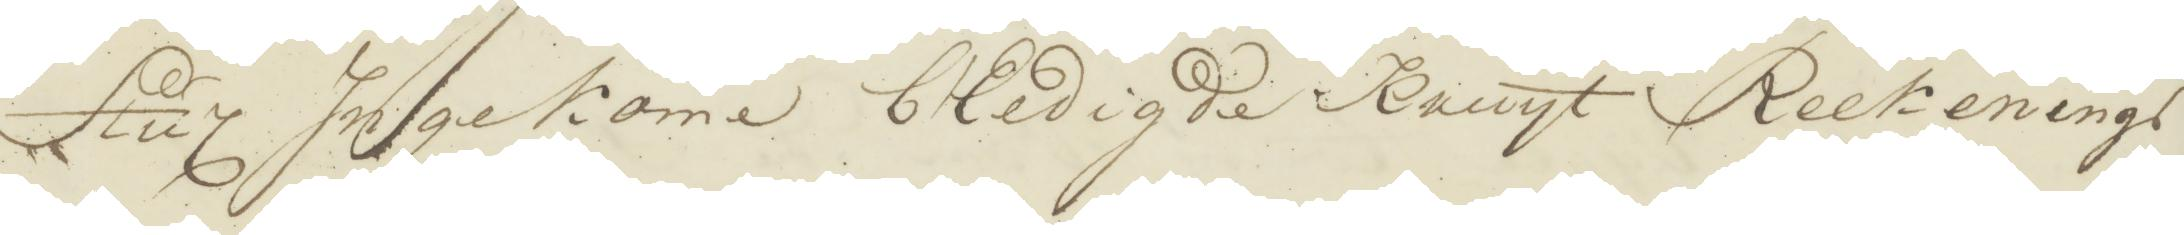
Stux Jngekome b'Eedigde Kruijt Reekenings
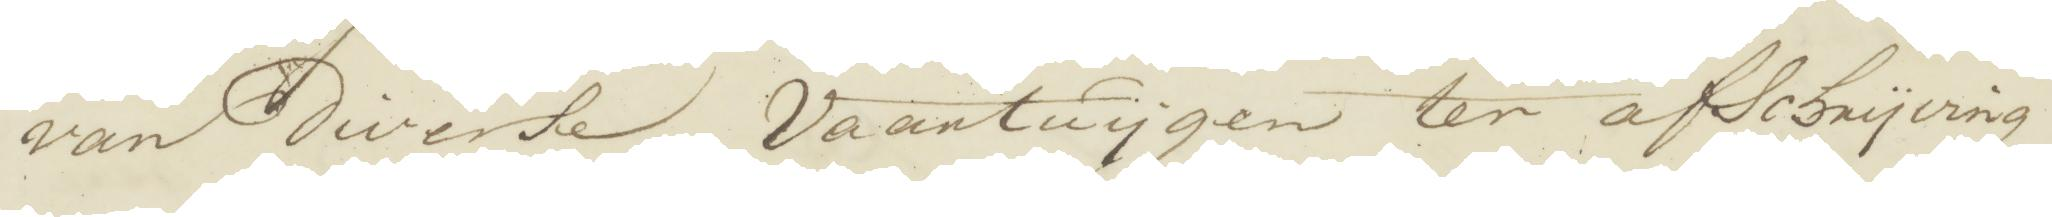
van diverse vaartuijgen ter afschrijving
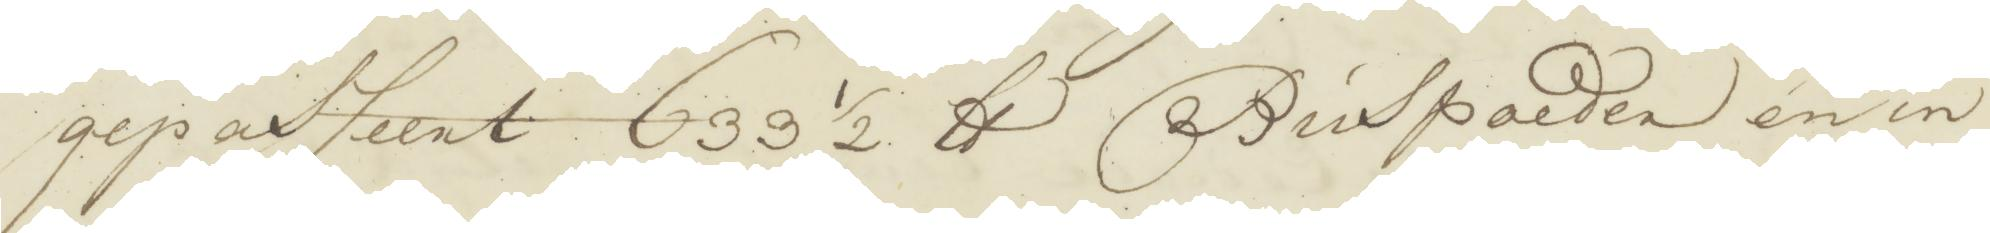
gepasseert 633 ½. lb Buspoeder en in
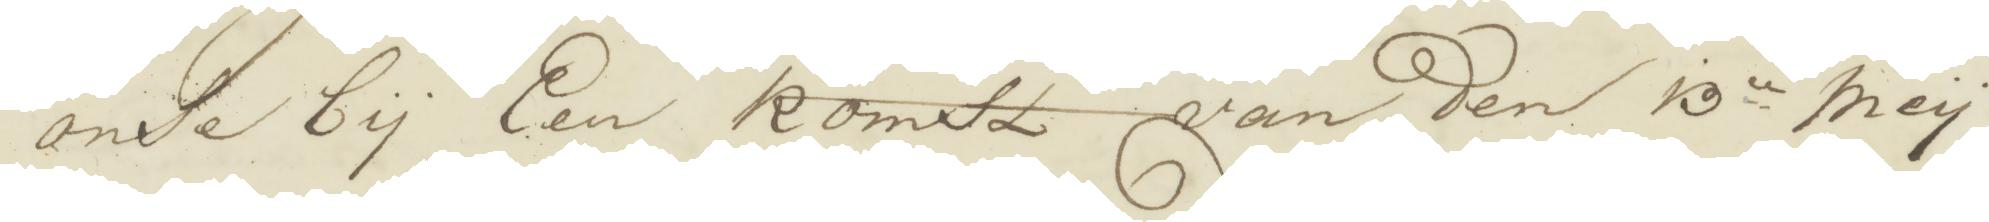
onse bij Een komst van den 13=e meij
